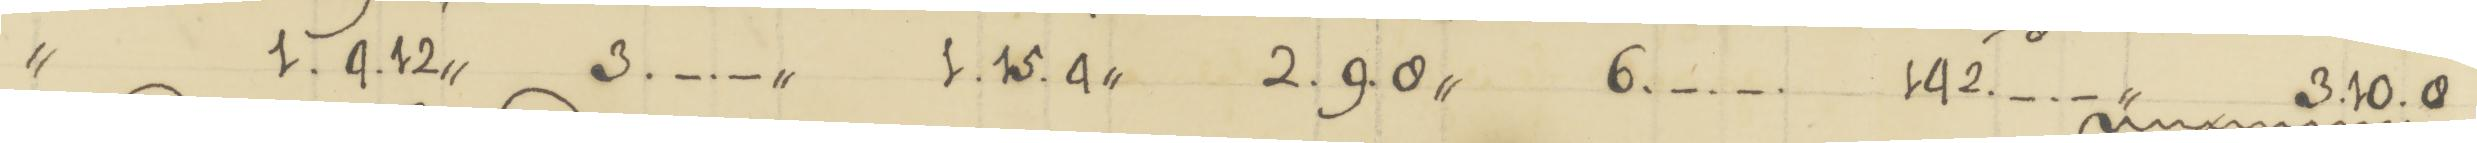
— 1.4.12„ 3.—.—„ 1:15.4„ 2.9.8„ 6.—. —. 142.—.—„ 3.10. 8
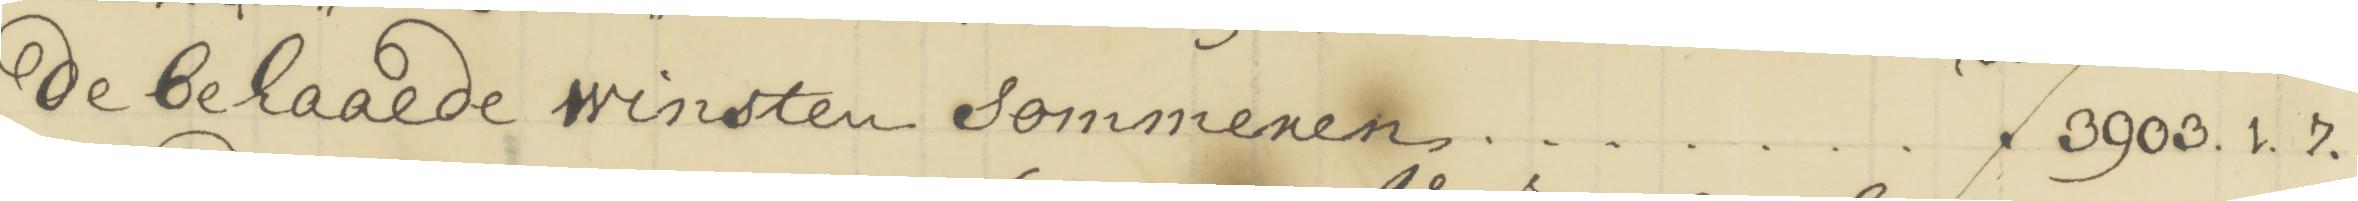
de behaalde winsten sommeren . . . . . . . ƒ3903.1.7.
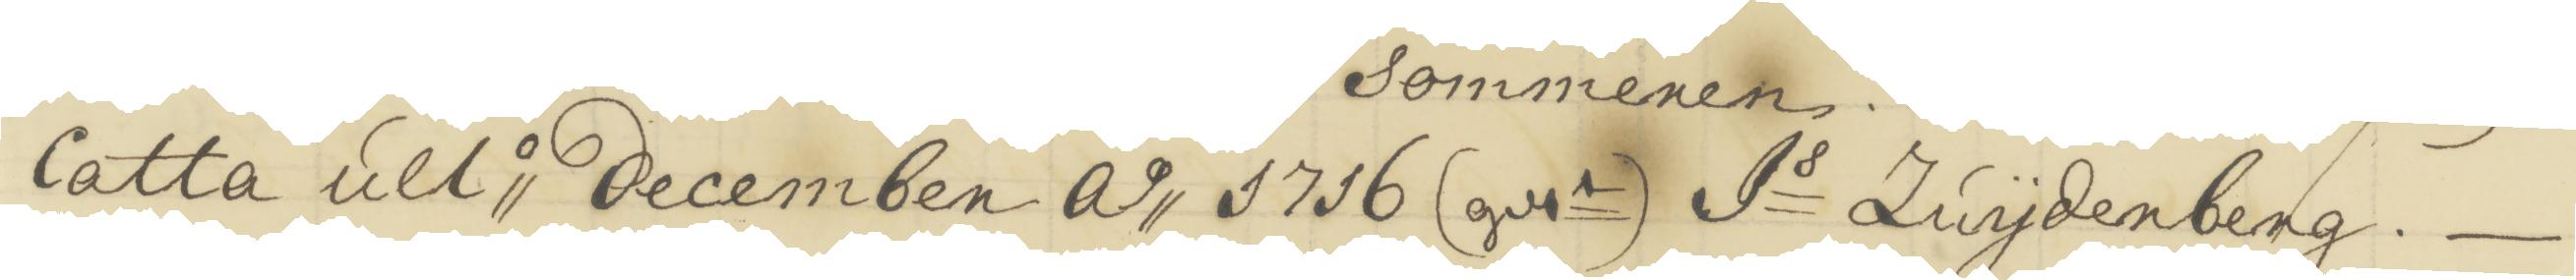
Catta ult„o december ao„ 1716 (get=t) I=s Zuijderberg.—
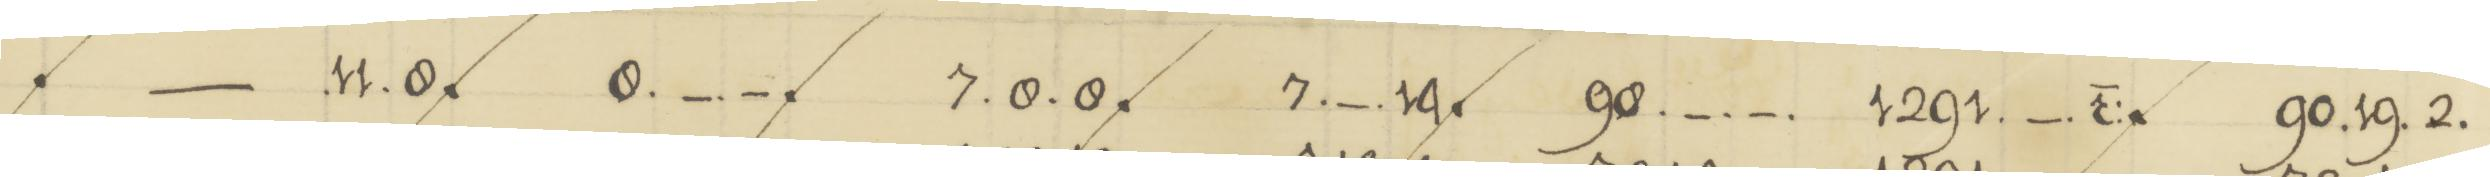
ƒ — .11.8ƒ 8.—.—ƒ 7.8.8ƒ 7.—.14ƒ 98.—.—. 1291.—.r:ƒ 90.19.2.
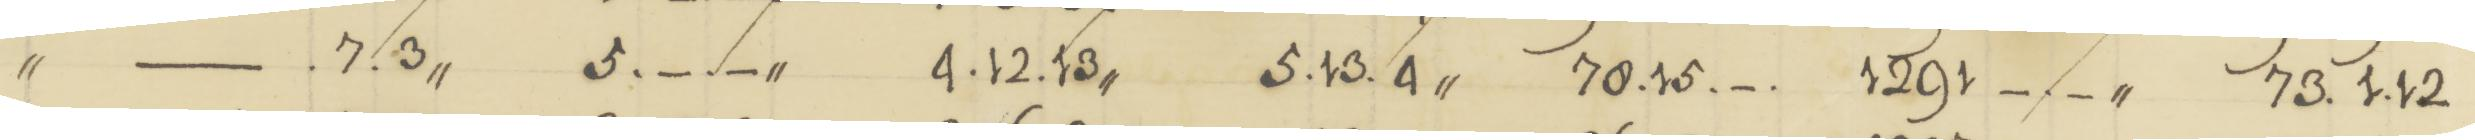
„ — .7.3„ 5.—.—„ 4.12.13„ 5.13.4„ 78.15.—. 1291—.—„ 73.1.12
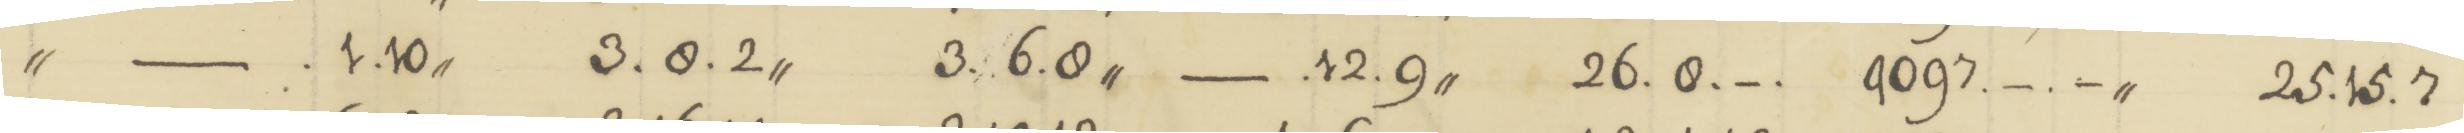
„ — .1.10„ 3.8.2„ 3.6.8„ —.12.9„ 26.8.—. 4097.—.—„ 25.15.7
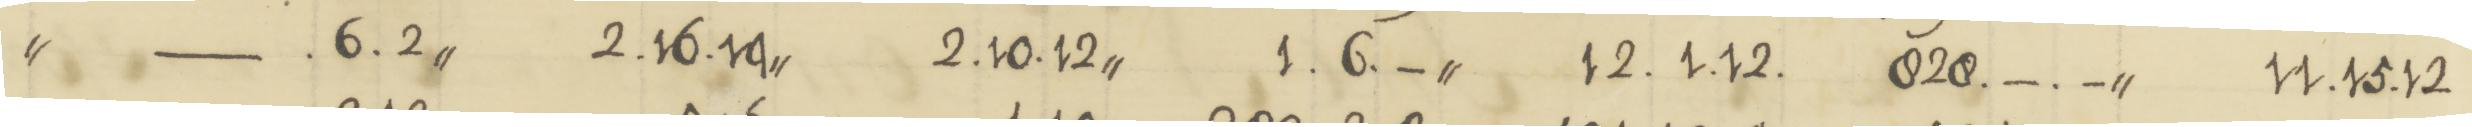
„ — .6.2„ 2.16.14„ 2.10.12„ 1.6.—„ 12.1.12. 828.—.—„ 11.15.12
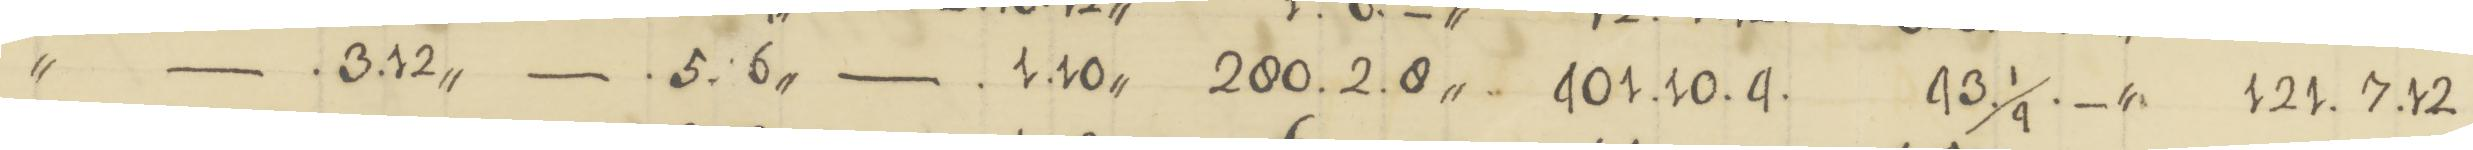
„ — .3.12„ — .5.6„ — .1.10„ 280.2.8„ 401.10.4. 43¼.—„ 121.7.12
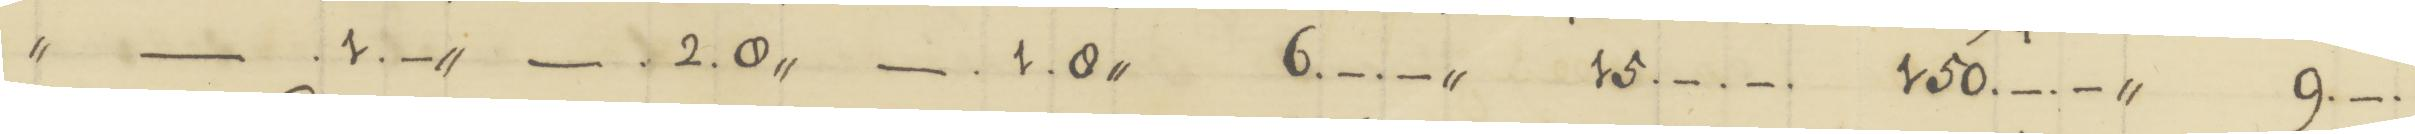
„ — .1.—„ — .2.8„ — .1.8„ 6.—.—„ 15.—.—. 150.—.—„ 9.—.—
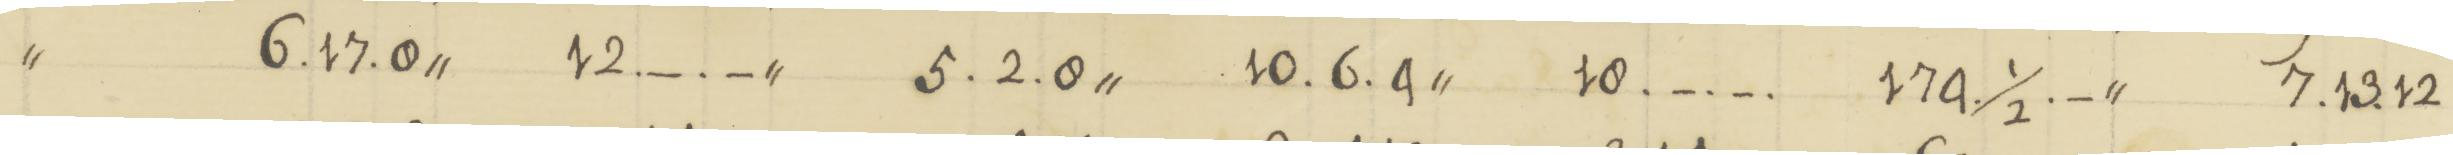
„ 6:17.8„ 12.—.—„ 5.2.8„ 10.6.4„ 18„—.—. 174.½.—„ 7.13.12
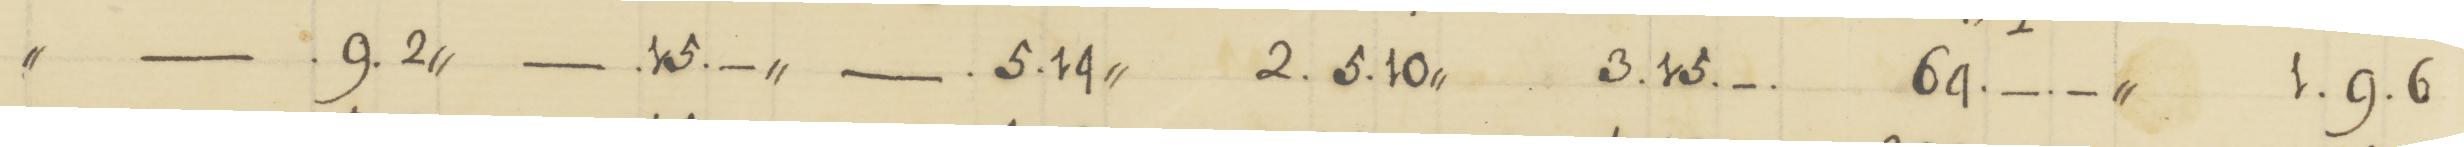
„ — .9.2„ —.15.—„ —. 5.14„ 2.5.10„ 3.15.—. 64.—.—„ 1.9.6
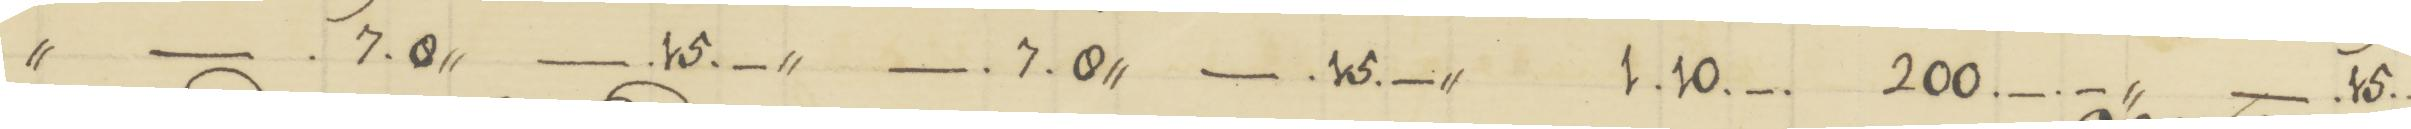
„ — .7.8„ —.15.— „ —.7.8„ —.15.—„ 1.10.—. 200.—.—„ —.15.—.
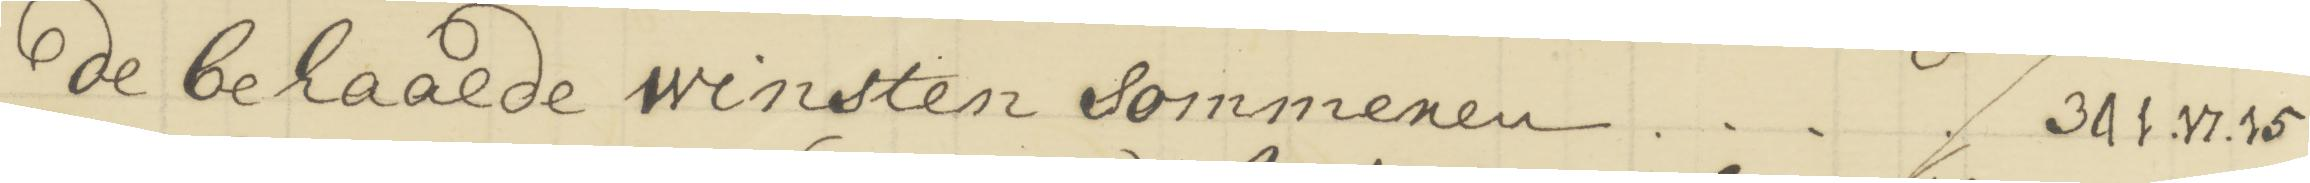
de behaalde winsten sommeren . . . . ƒ 341.17.15
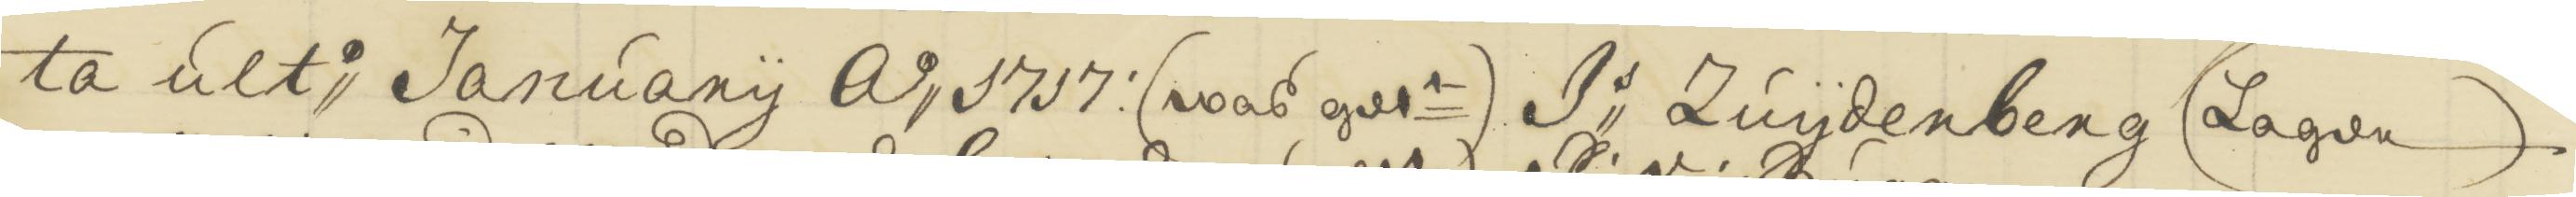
ta ult„o Januarij A„o 1717: (was get=t) J„s Zuijderberg (Lager)
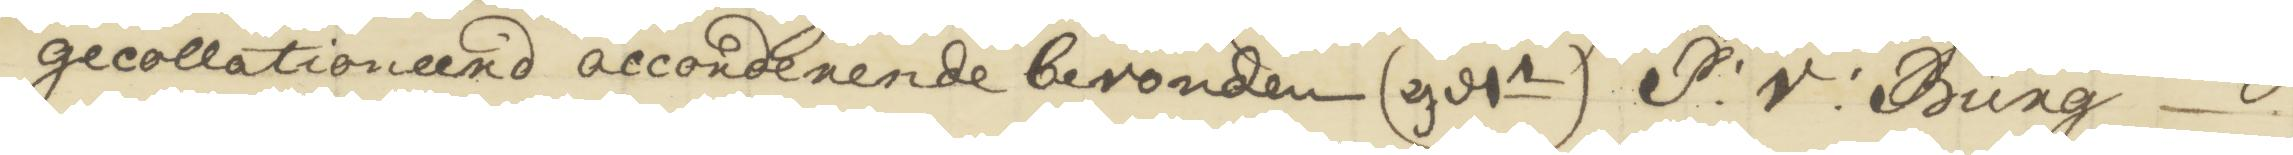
gecollationeerd accorderende bevonden (get=t ) P: v: Burg —
